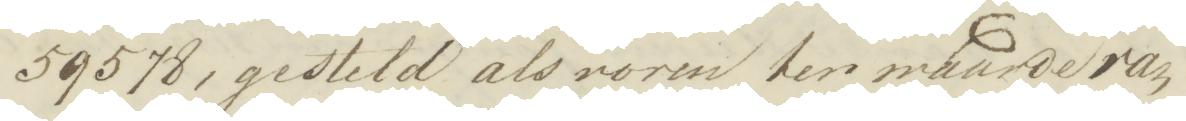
59578, gesteld als voren ter waarde van
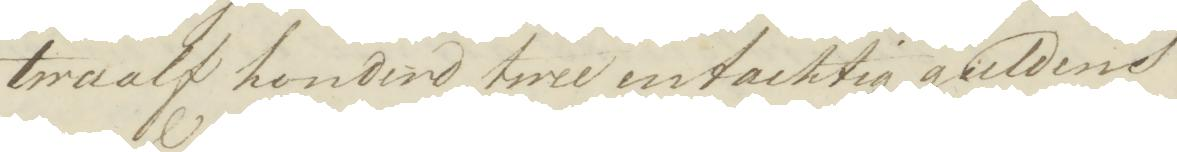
twaalf honderd twee entachtig guldens
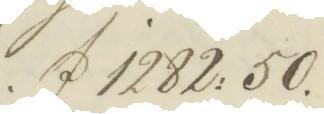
. ƒ 1282: 50.
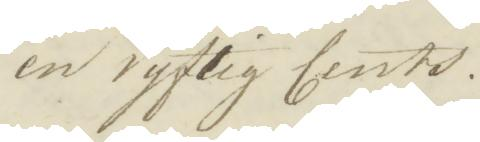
en vyftig Cents.
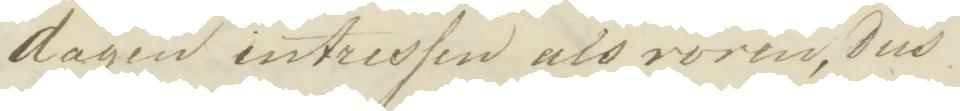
dagen intressen als voren, dus
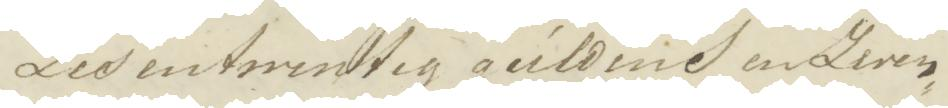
Zes en twintig guldens en Zeven„
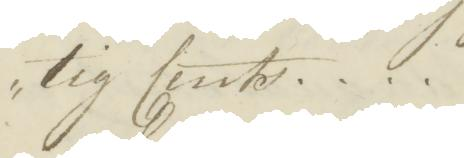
„tig Cents. . . .
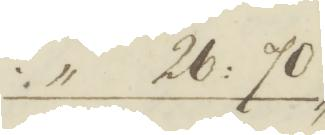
„ 26: 70
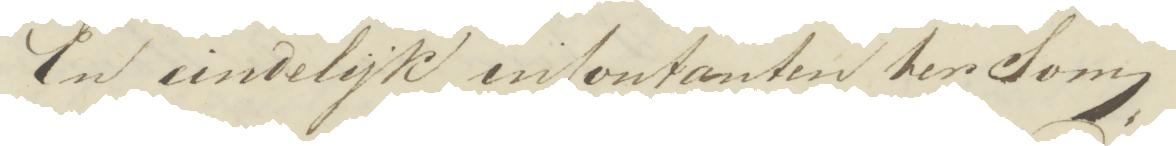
En eindelijk in Contanten ter Som„
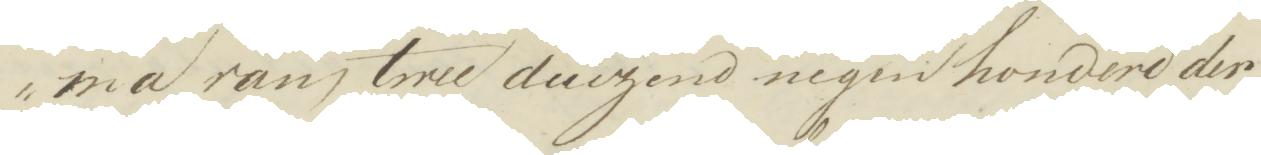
„ma van twee duizend negen honderd der
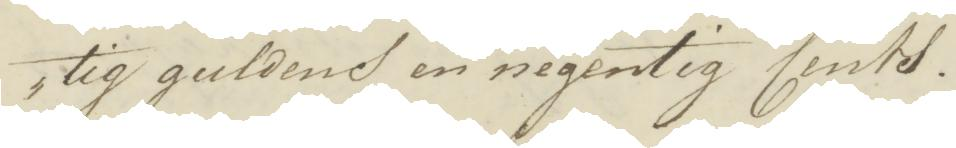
„tig guldens en negentig Cents.
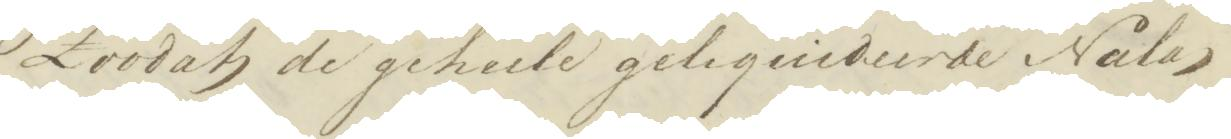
Zoodat de geheele geliquideerde Nala
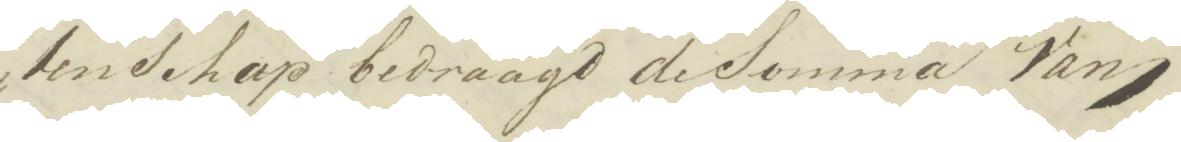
tenschap bedraagd de Somma Van
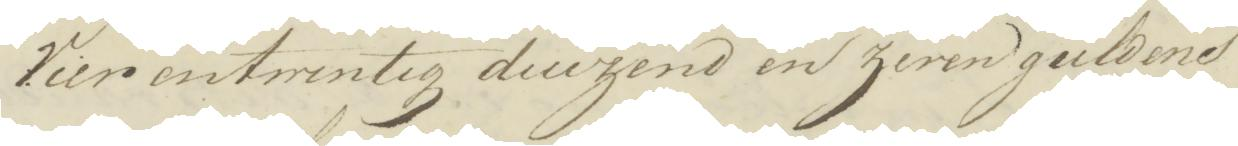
Vier en twintig duizend en zeven guldens
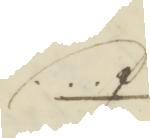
. . . ƒ
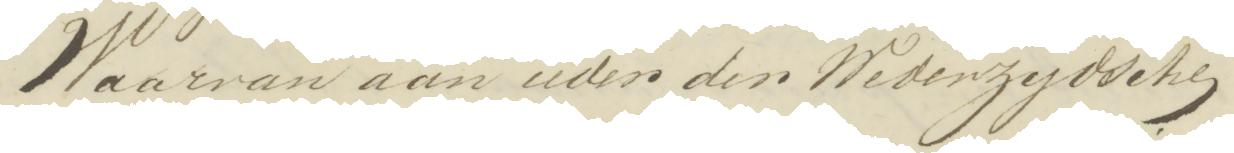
Waarvan aan ieder den Wederzydsche
